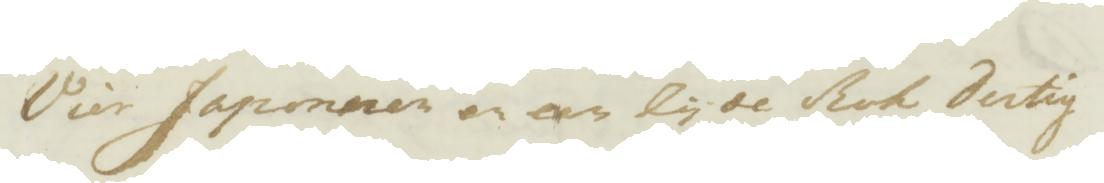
Vier Japonnen en een zijde Rok, dertig
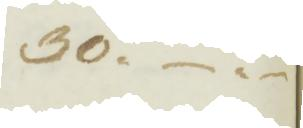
30„ — „ —
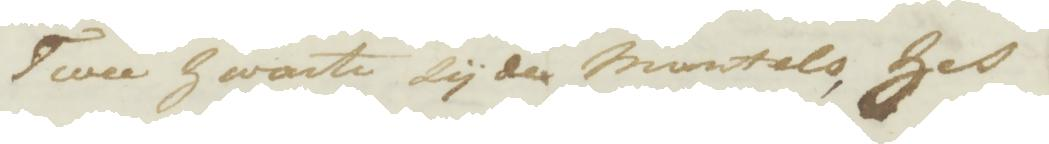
Twee Swarte zijden Mantels, Zes
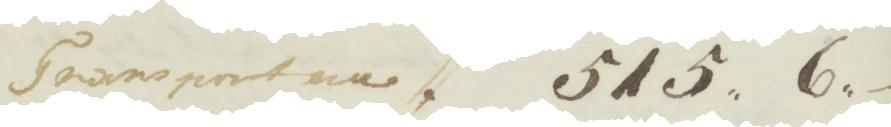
Transportere ƒ 515„ 6„ -
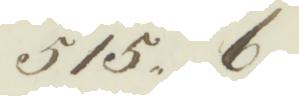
515„ 6
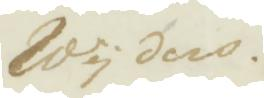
Wijders.
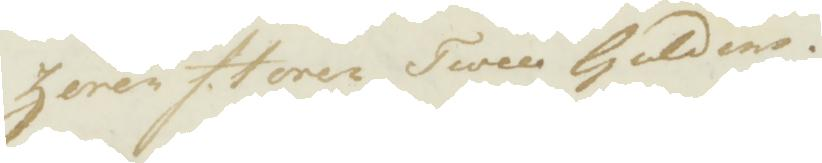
Zeven stoven, Twee Guldens
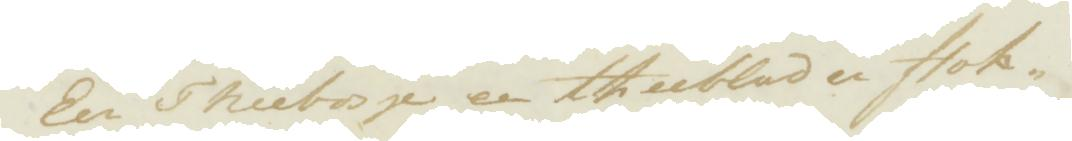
Een Theebosje, een theeblad en stok„
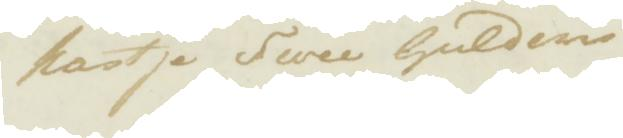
kastje, Twee Guldens
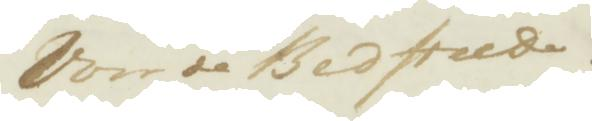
voor de Bedsteede.
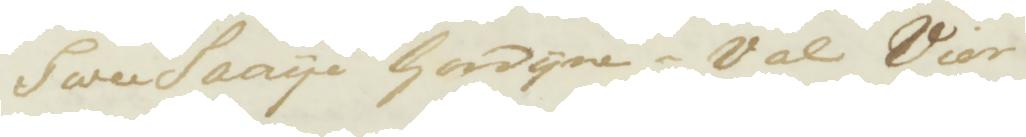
Twee Saaije Gordijnen en Val Vier
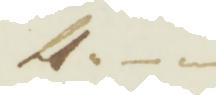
4„ — —
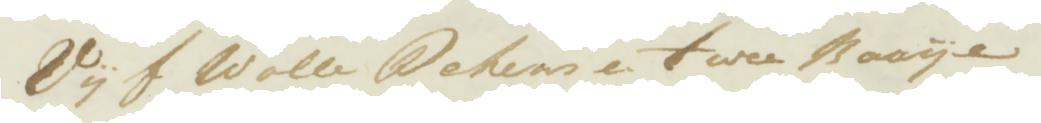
Vijf Wollen Dekens en twee Baaije
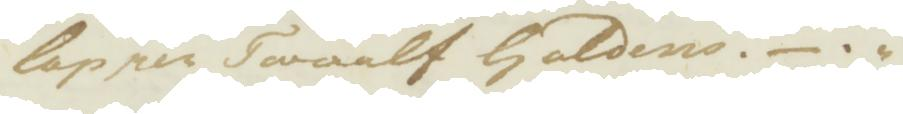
lappen, Twaalf Guldens. — . „
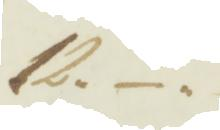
12„ — „
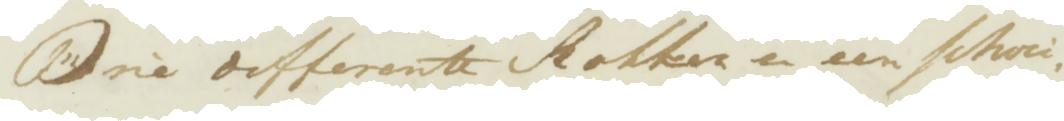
Drie differente Rokken en een schou
